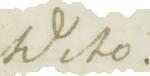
Dito. . . . . . . .
